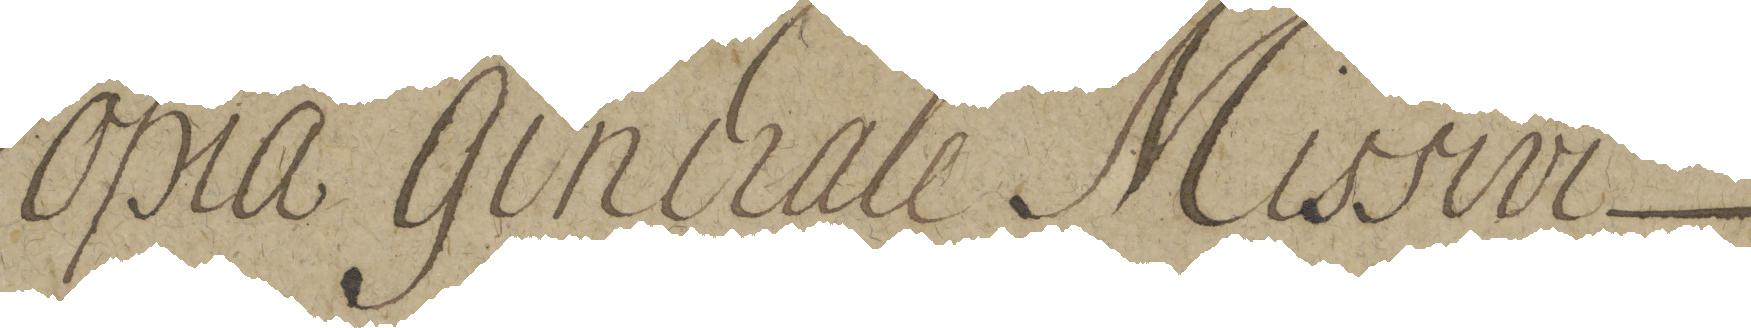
Copia generale Missive
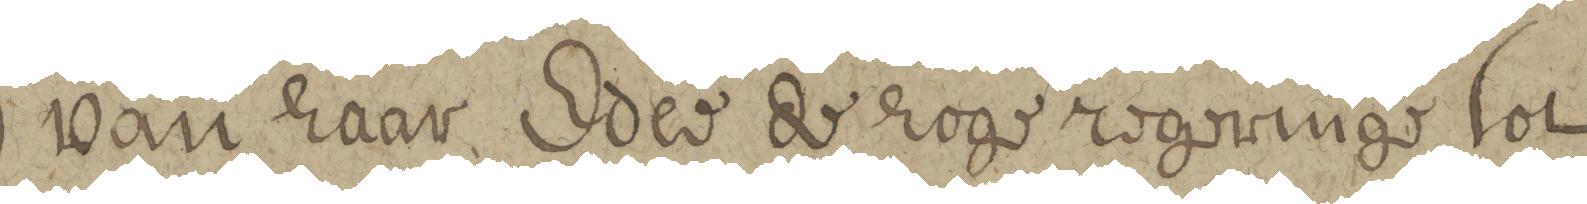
van haar Edle de hoge regeringe tot
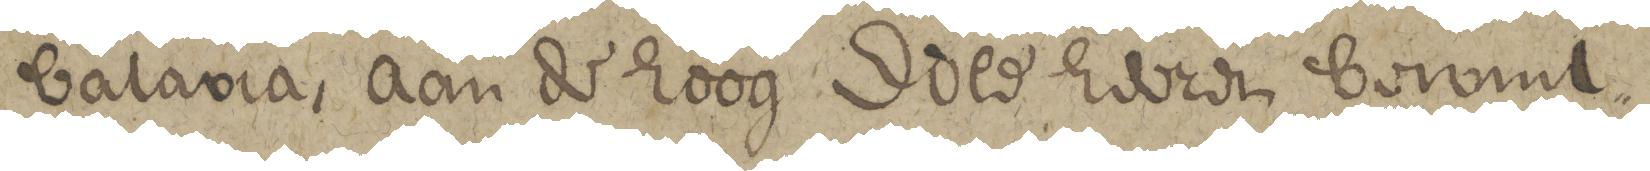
batavia, aan de hoog Edle bewint„
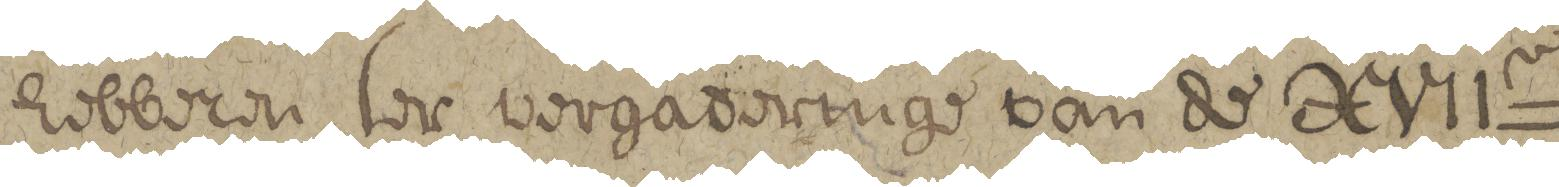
hebberen ter vergaderinge van de XVII=e
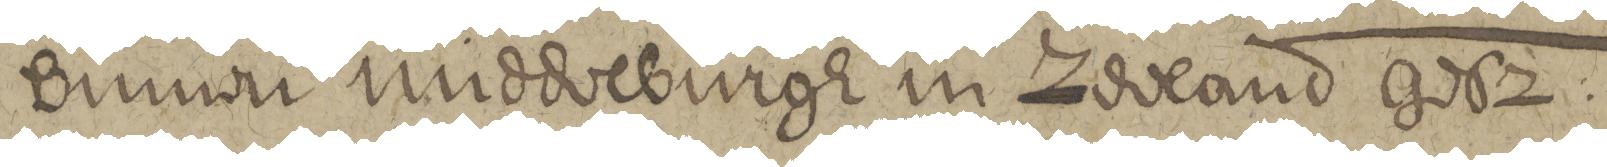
binnen middelburgh in Zeeland gesz:
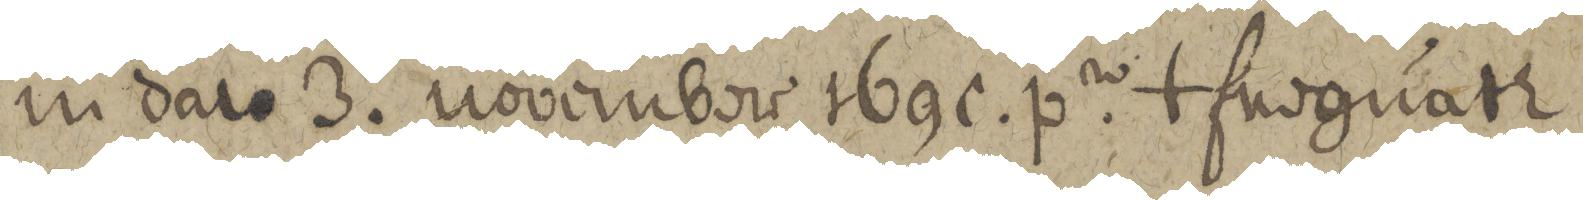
in dato 3.e november 1695. p:r t freguath
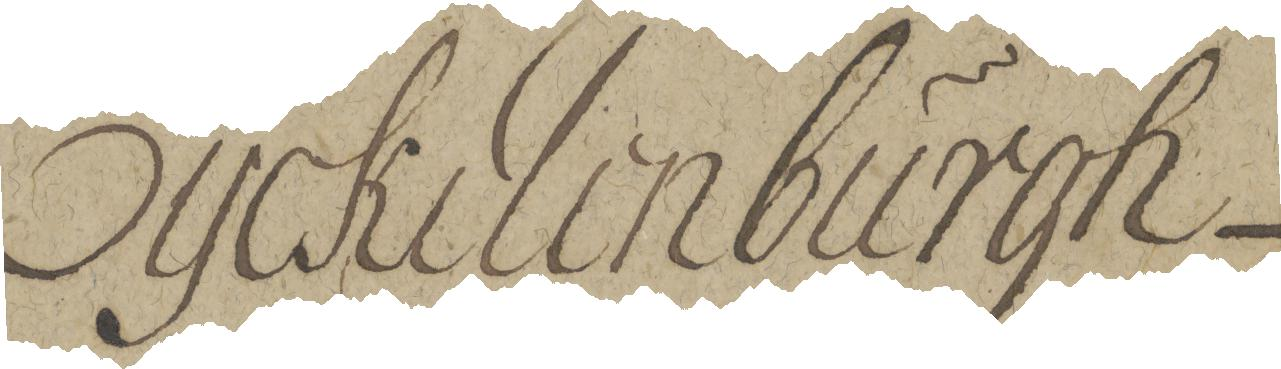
Eijckelinburgh
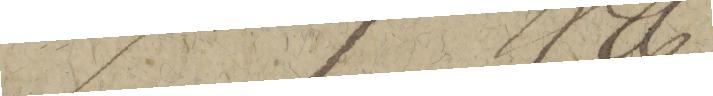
Lra
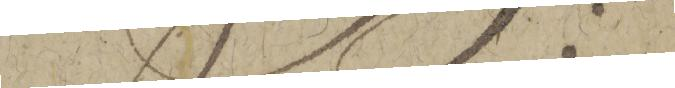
B:
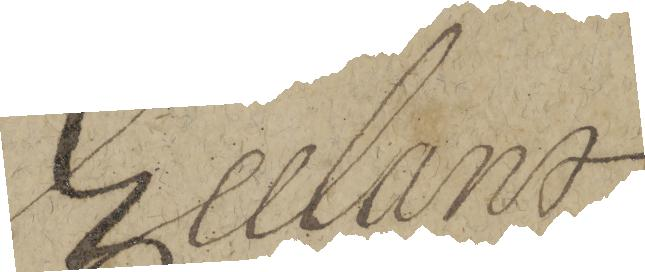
Zeelant
